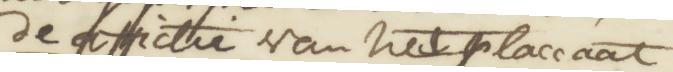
de affictie van het placcaat
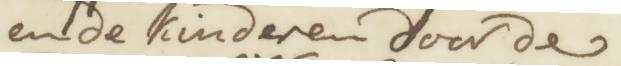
en de kinderen door de
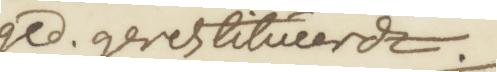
ged. gerestitueerdt.
